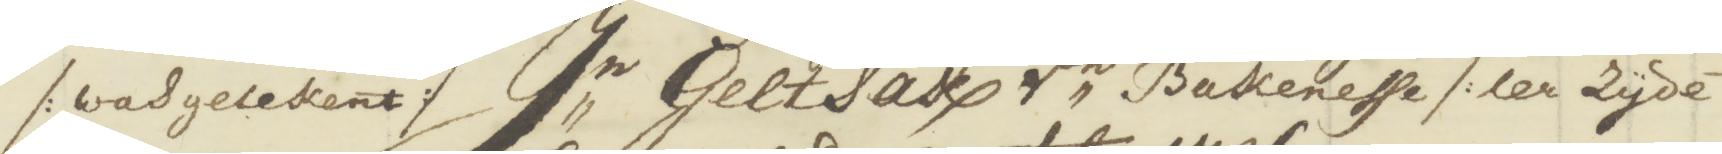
/:was getekent:/ J„n Geltsak v„n Bakenesse /:ter zijde
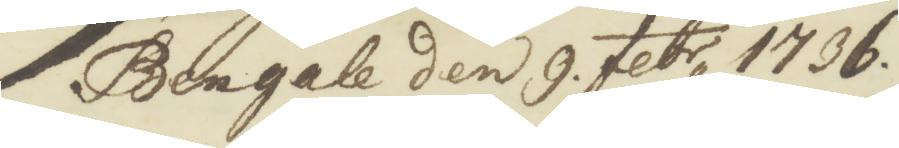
Bengale den 9. feb„ 1736.
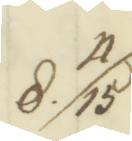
8 4/15
